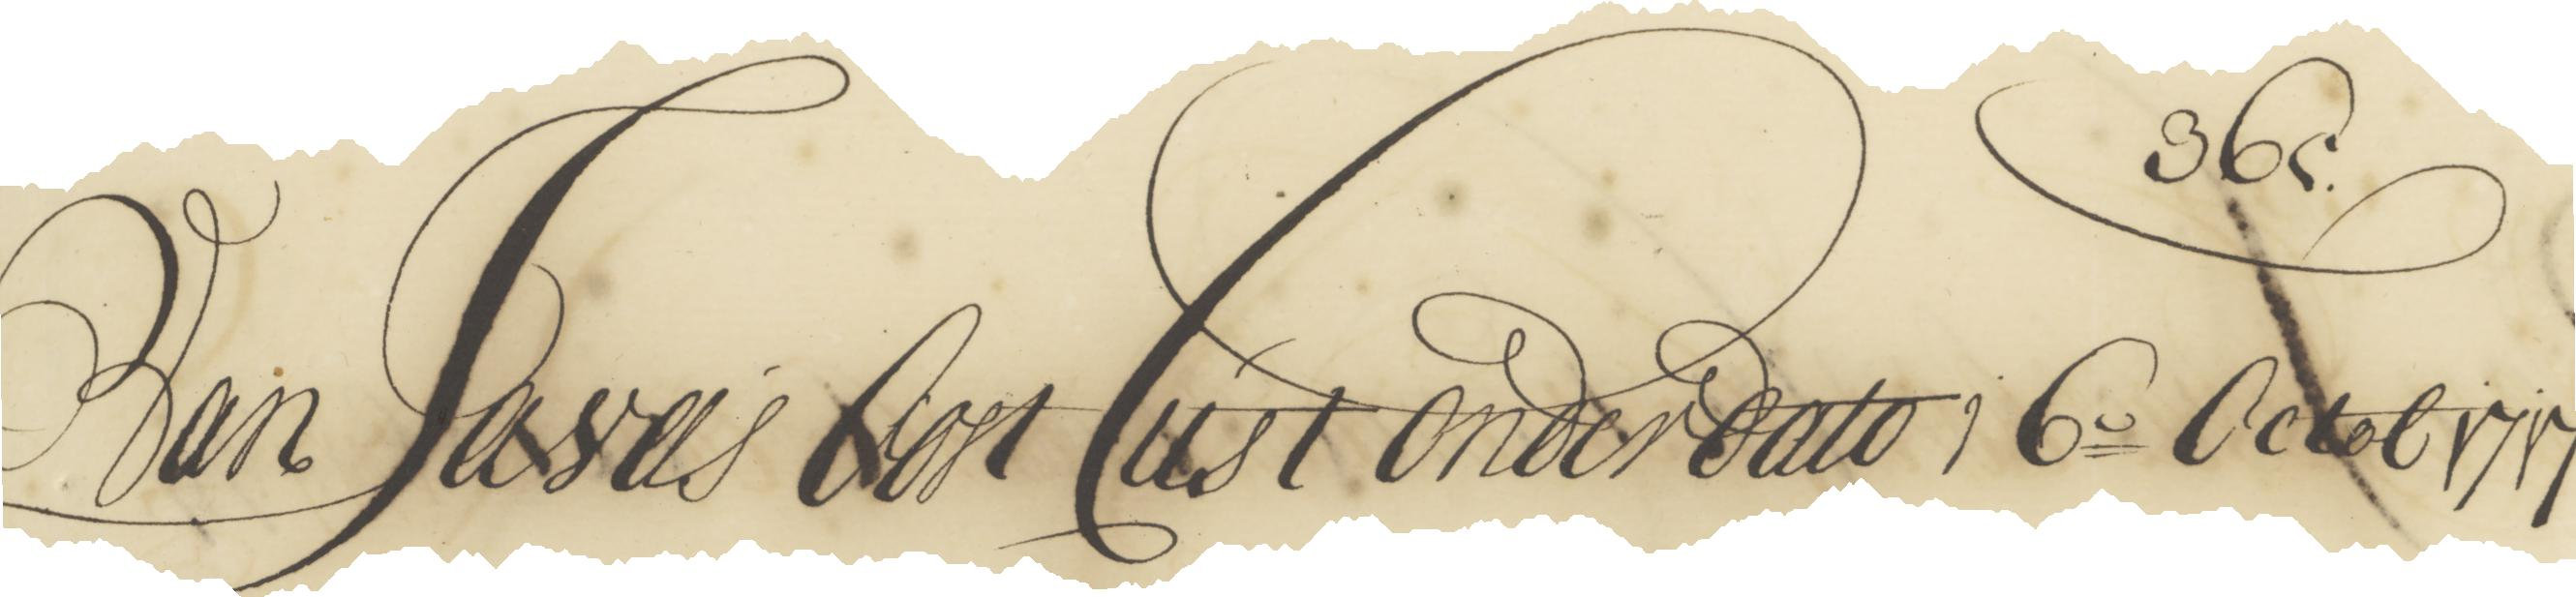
Van Java's Oost Cust onder dato 16=e Octob 1717
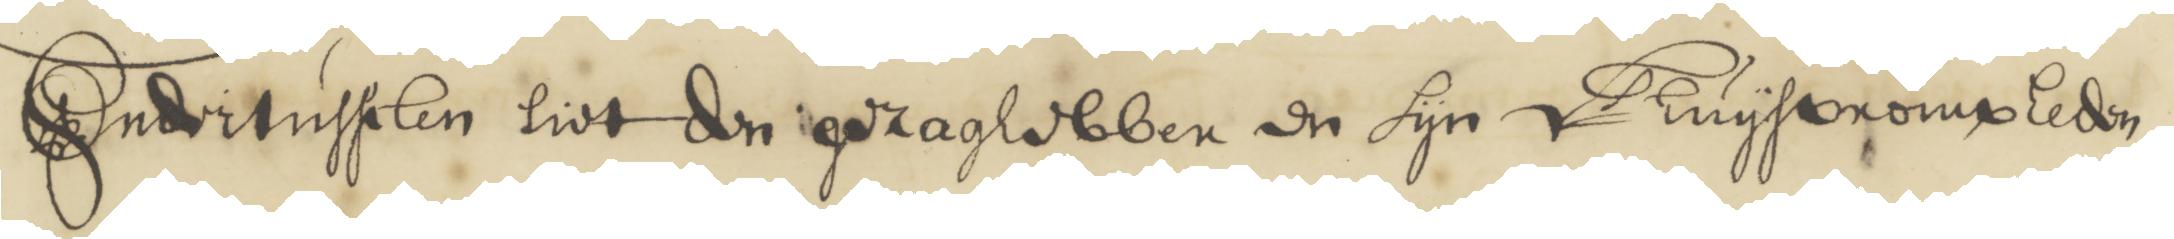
Ondertusschen liet den gezaghebber en sijn E=s huijsvrouw heden
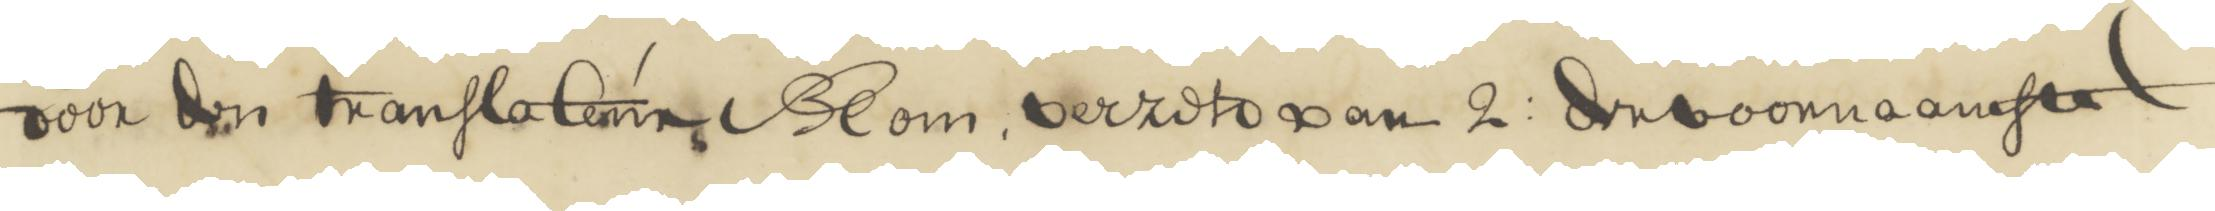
door den translateur Blom, verzeld van 2: der voornaamste
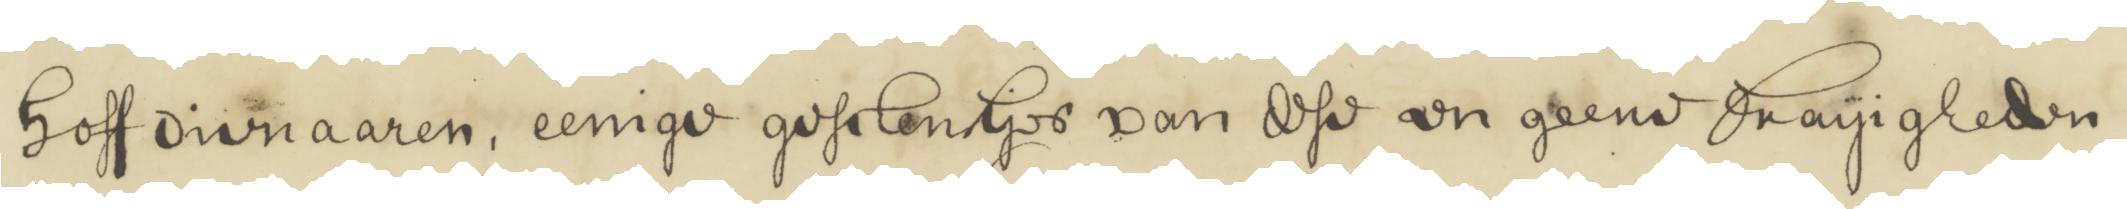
hoff dienaaren, eenige geschenkjes van dese en geene fraijigheden
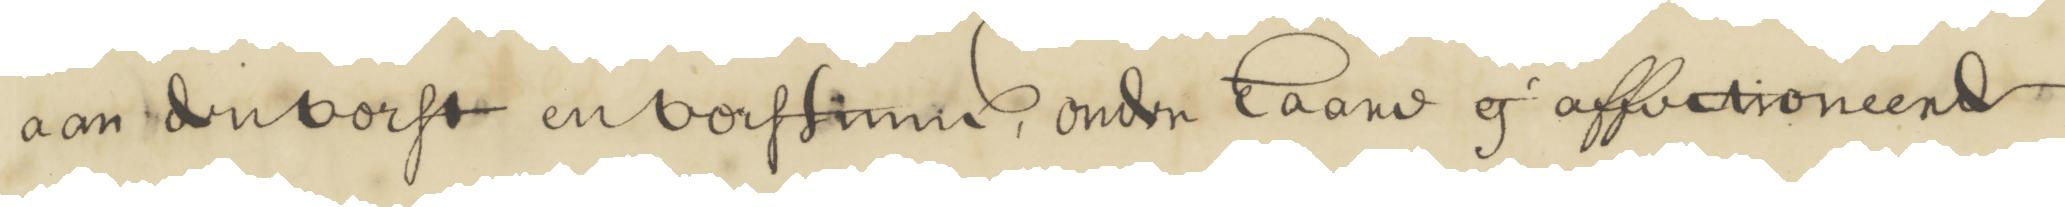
aan den vorst en vorstinne, onder haare g’affectioneerde
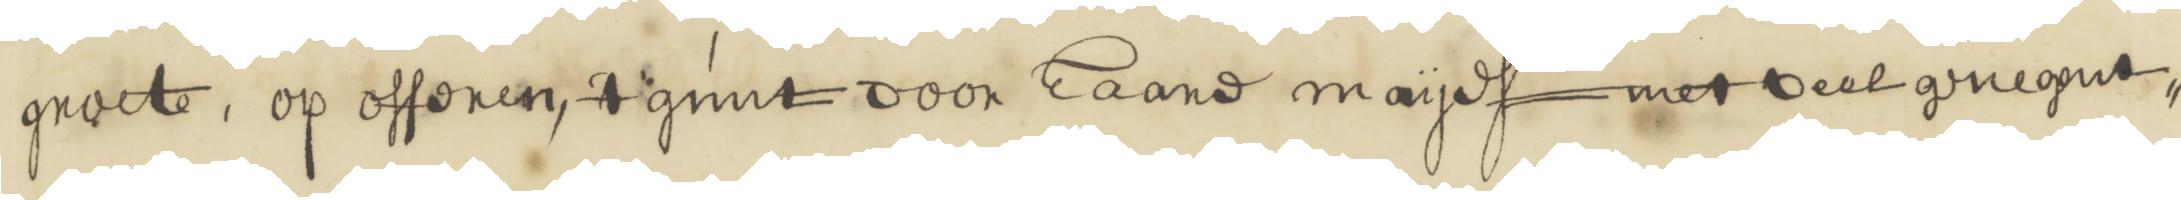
groete, op offeren, ’t gunt door haare maijes=ten met veel genegent
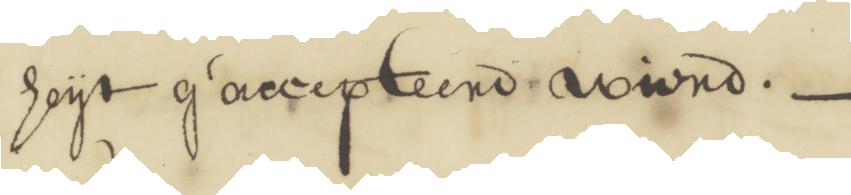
heijt g’accepteerd wierd.
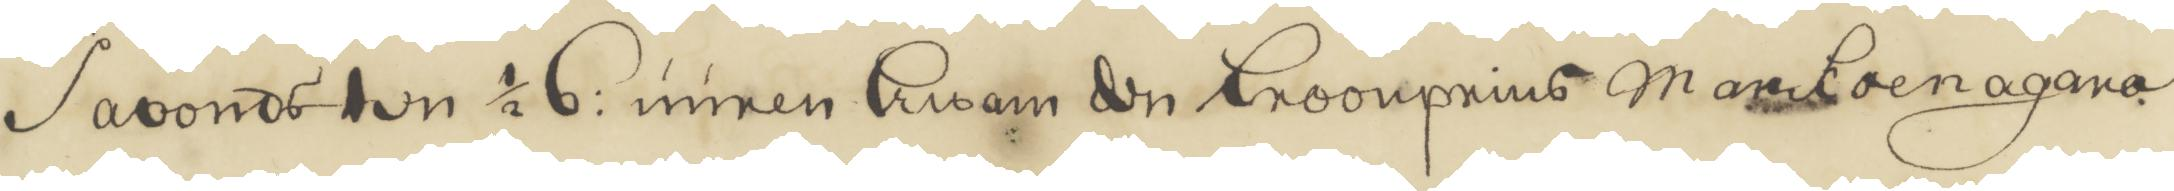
's avonds ten ½6: uuren kwam den kroonprins mankoenagara
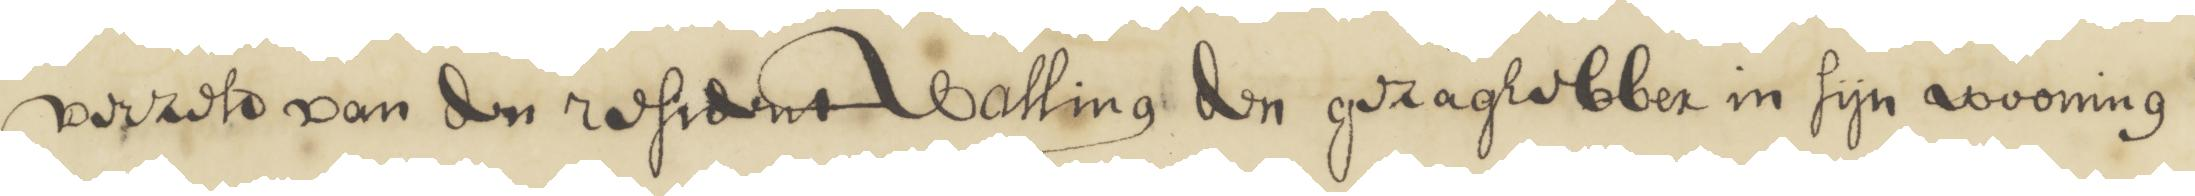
verzeld van den resident walling den gezaghebber in sijn wooning
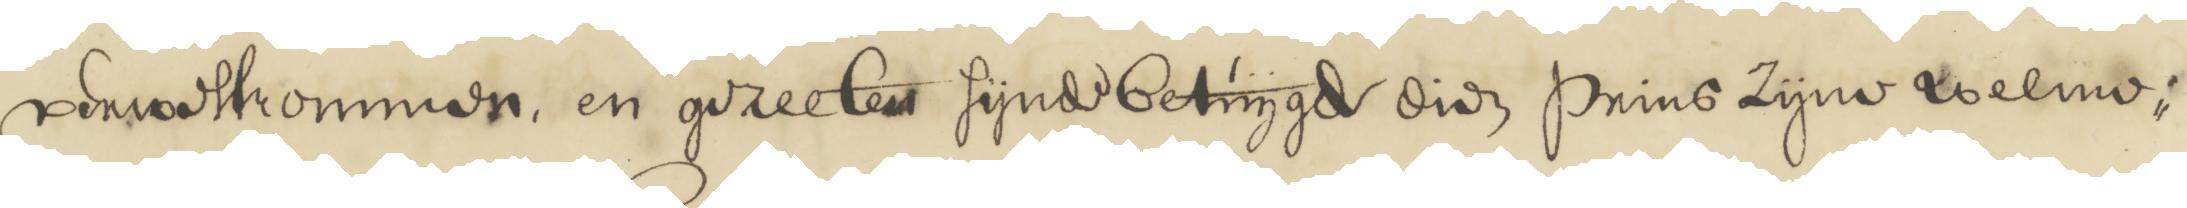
verwelkommen, en gezeeten sijnde betuijgde dien prins zijne welme„
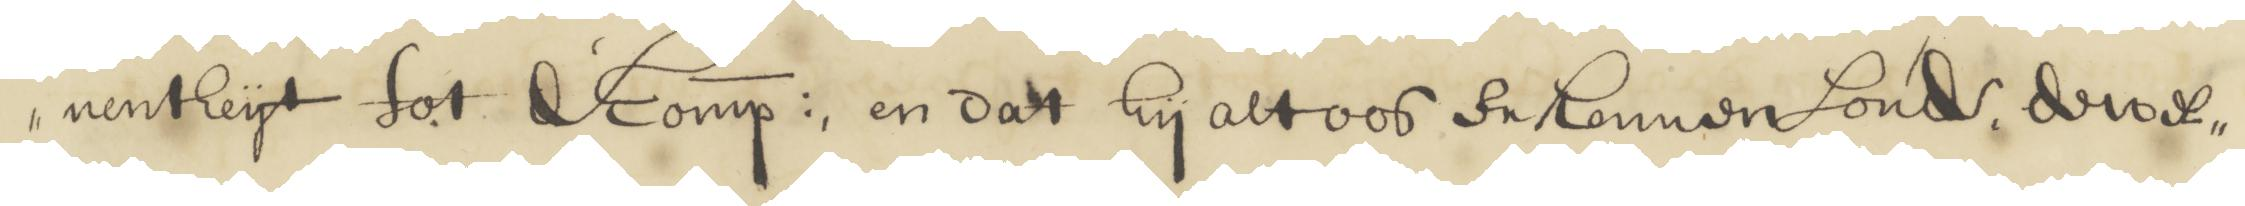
„nentheijt tot d'Ecomp:, en dat hij altoos erkonnen soude, de wel„
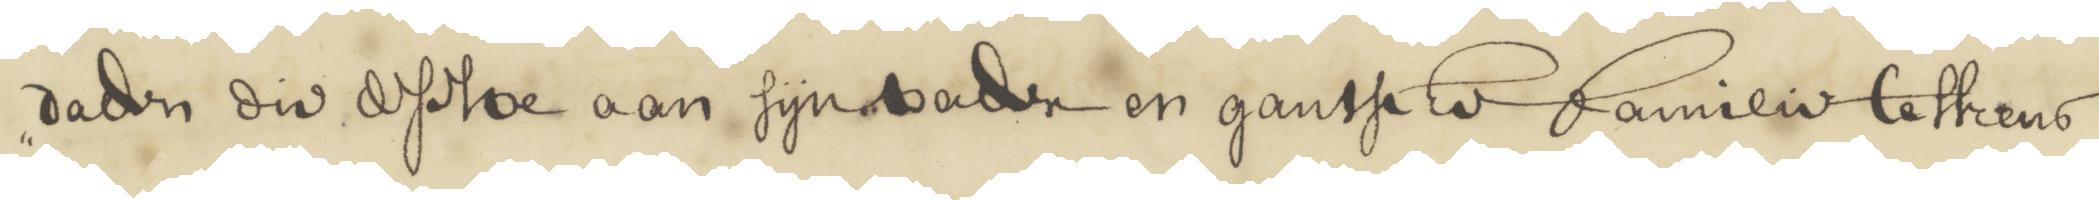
„daden die deselve aan sijn vader en gantsche familie telkens
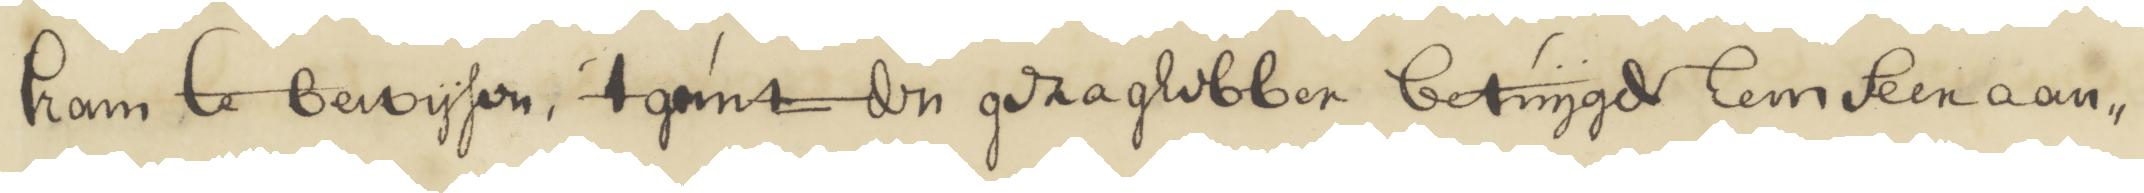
kam te bewijsen, ’t gunt den gezaghebber betuijgde hem seer aan„
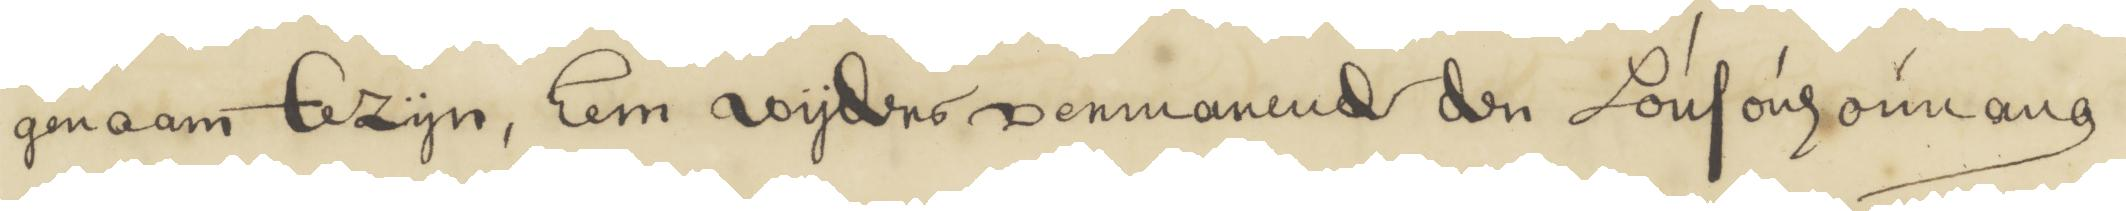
genaam te zijn, hem wijders vermanende den sousouhounang
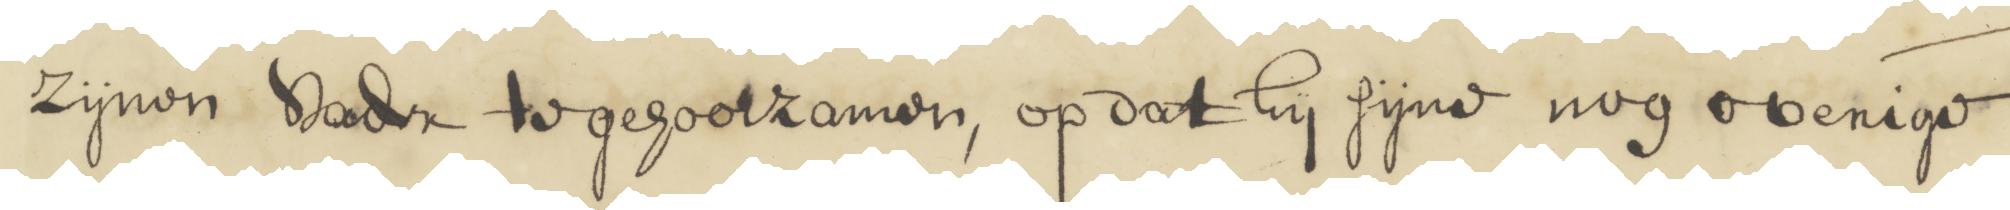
zijnen vader te gehoorzamen, op dat hij sijne nog overige
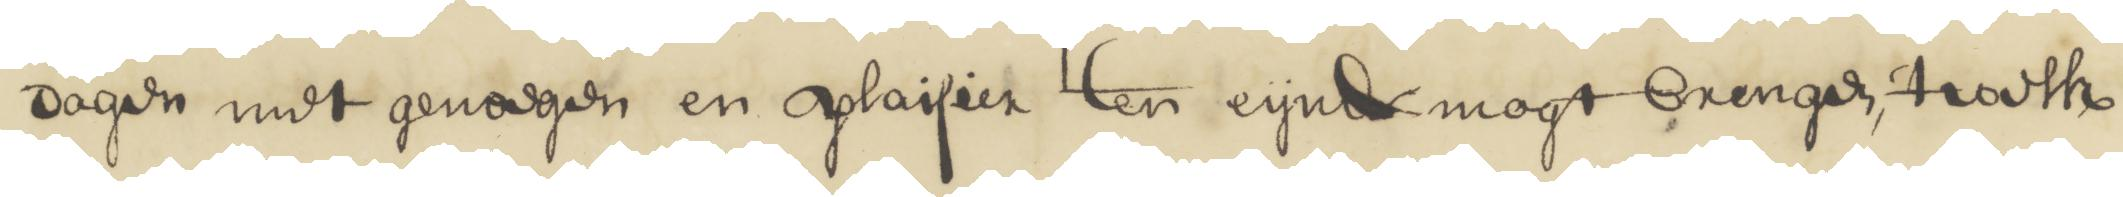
dagen met genoegen en plaisier ten eijnde mogt brengen, 'twelk
